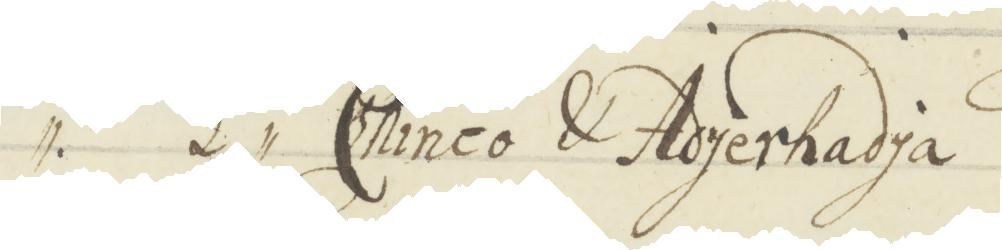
„ P„lo Chinco & Adjerhadja
